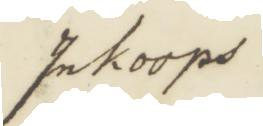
Jnkoops
